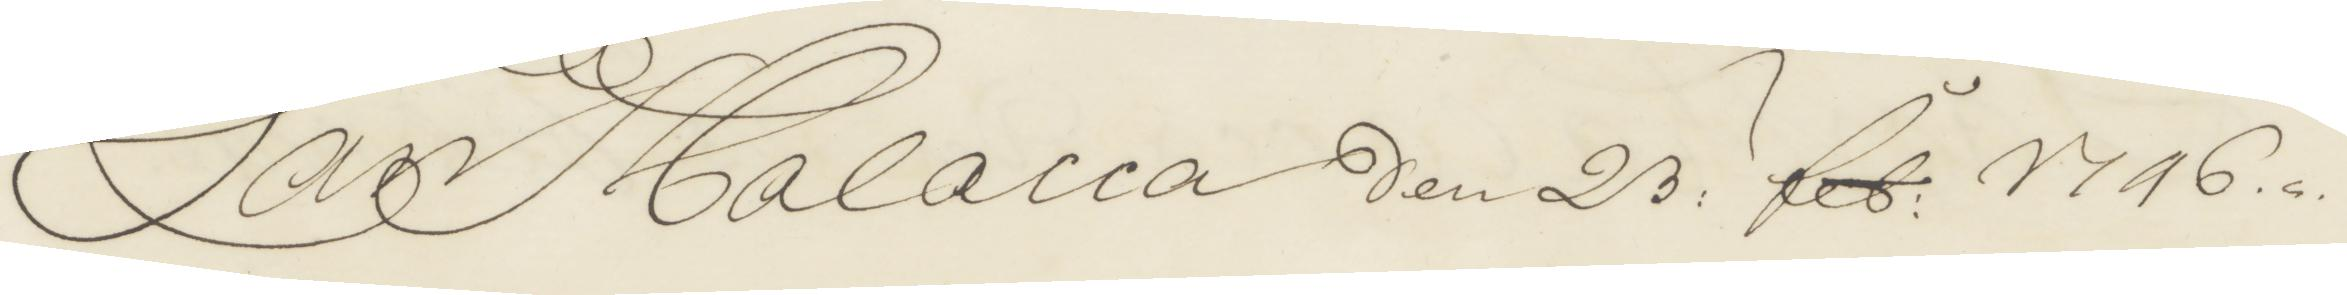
Van Malacca den 23:' feb:' 1746.„.
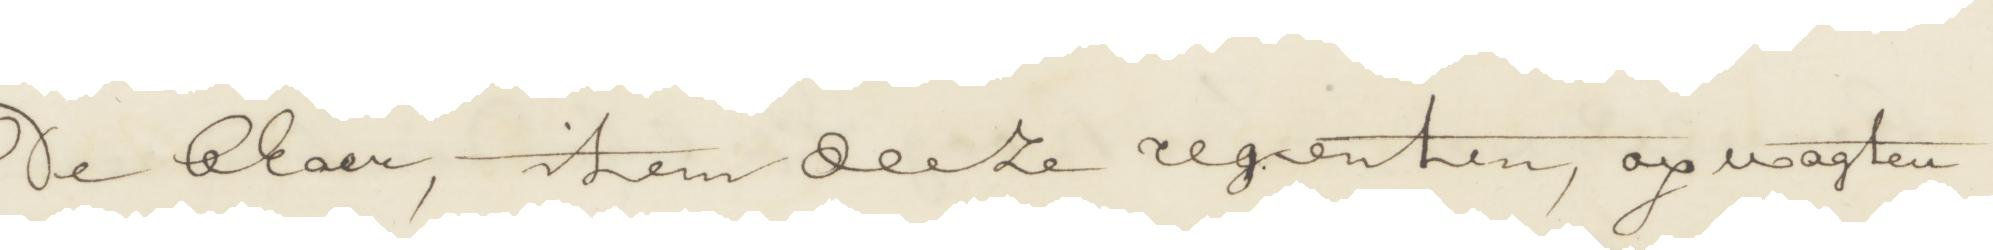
de bhaer, item deeze regenten, op wagten
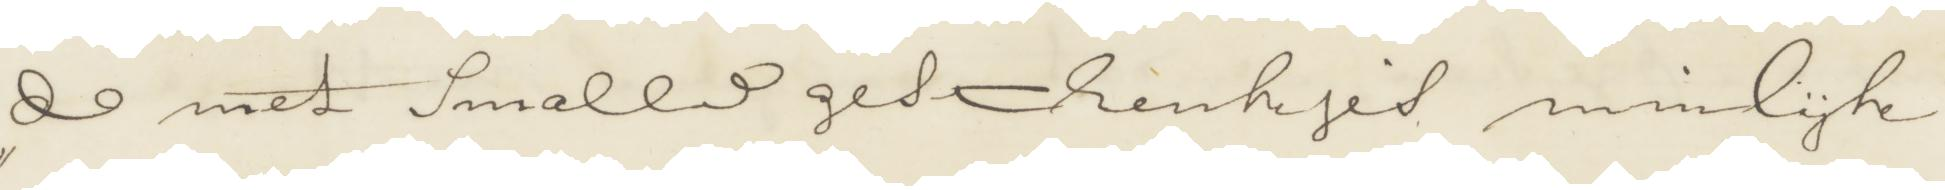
„de met smalle geschenkjes minlijk
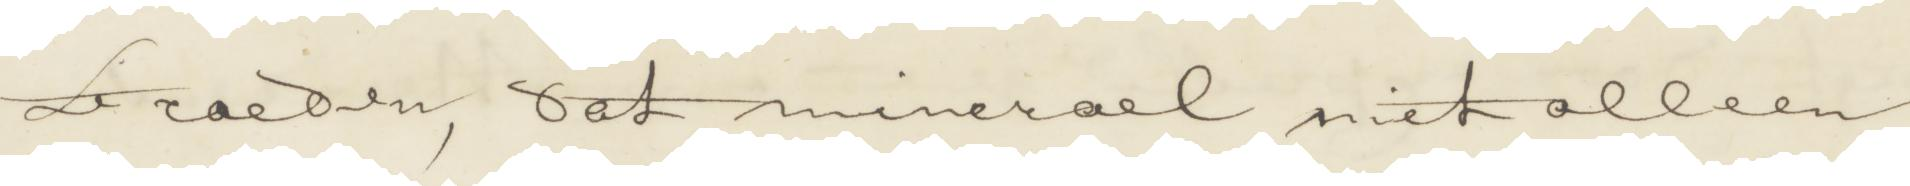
te raeden, dat minerael niet alleen
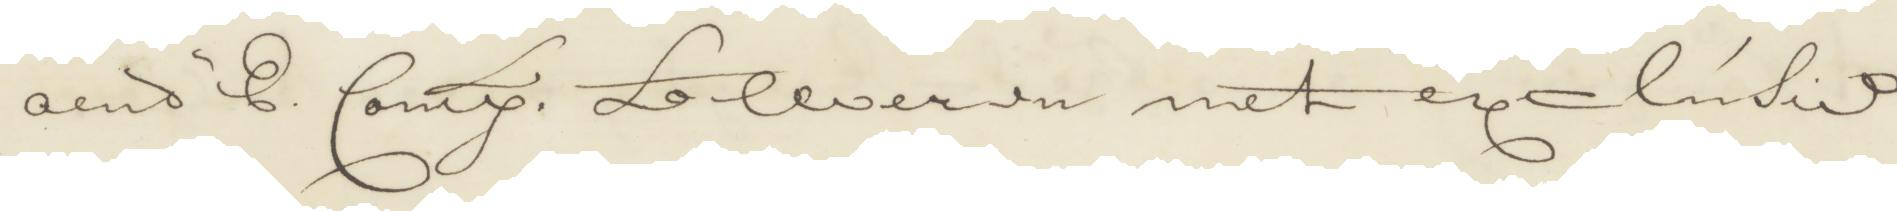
aen d' E. Comp. te leveren met exclusie
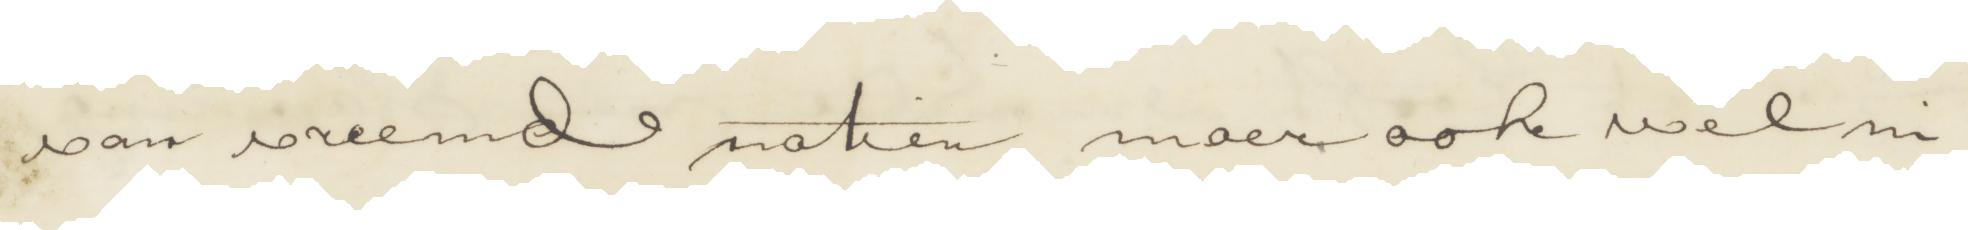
van vreemde natien, maer ook wel in
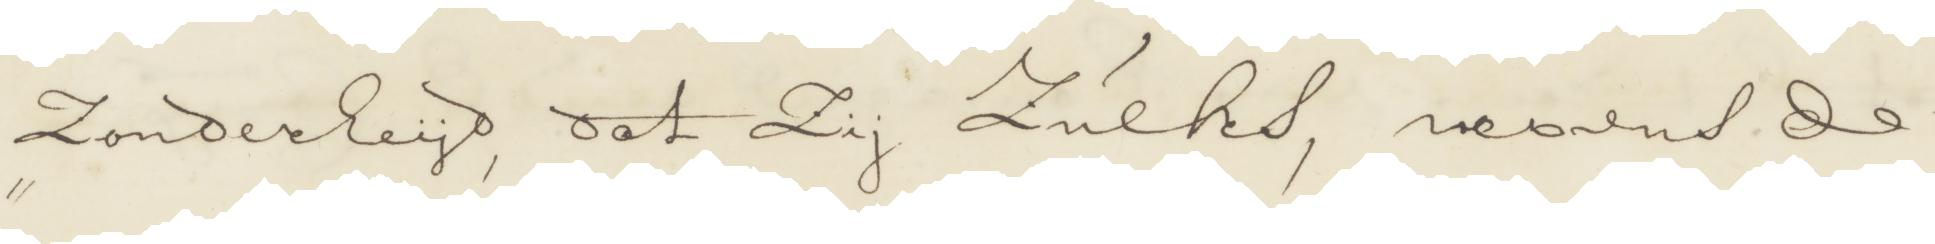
„zonderheijd, dat zij zulks, nevens de
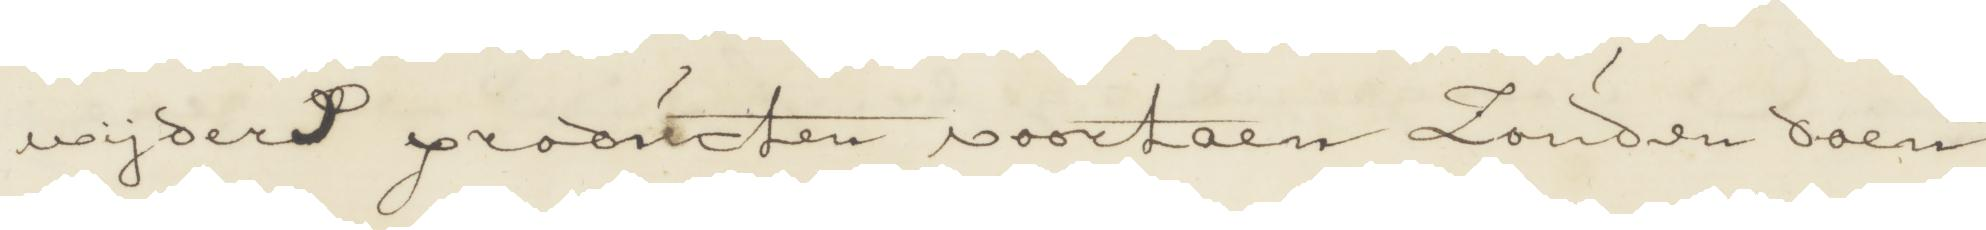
wijders producten voortaen zouden doen
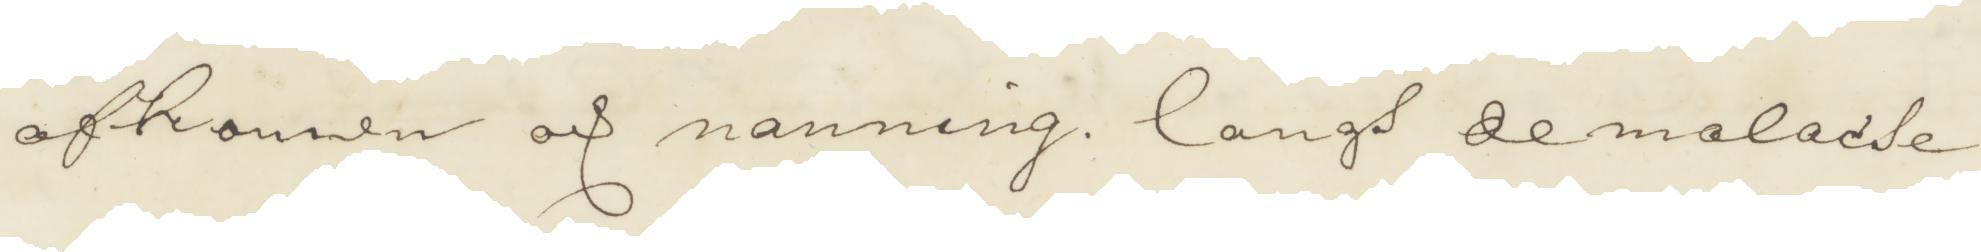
afkomen over nanning. langs de malacse
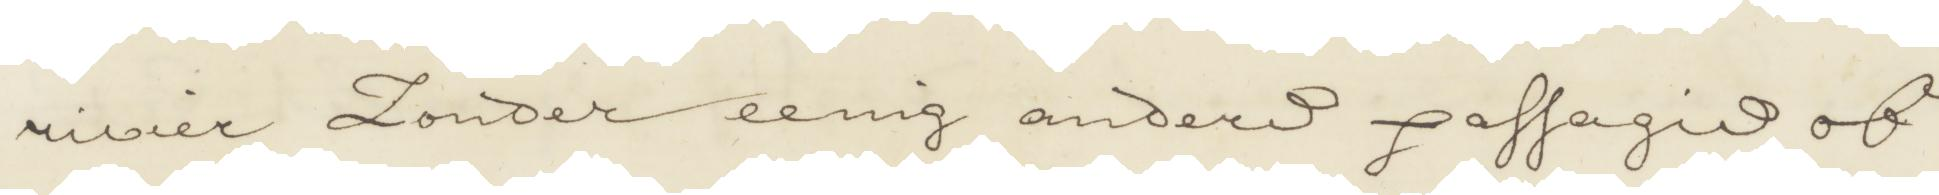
rivier, zonder eenig andere passagie of
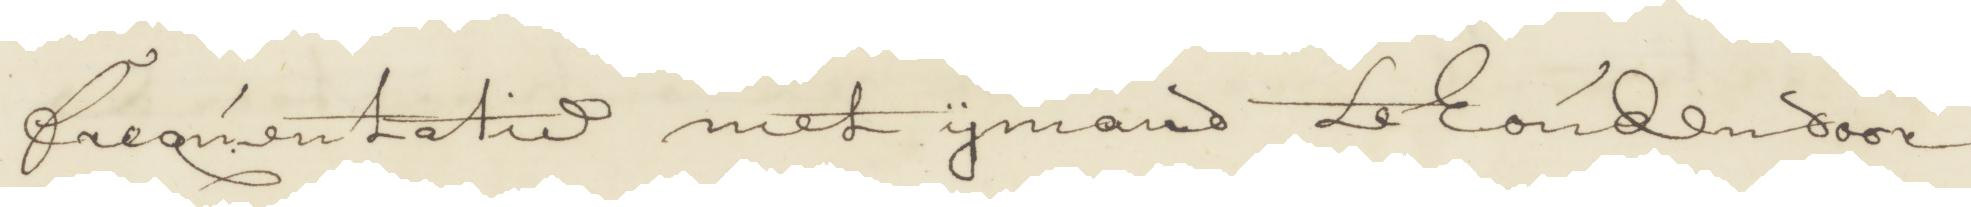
frequentatie met ijmand te houden door
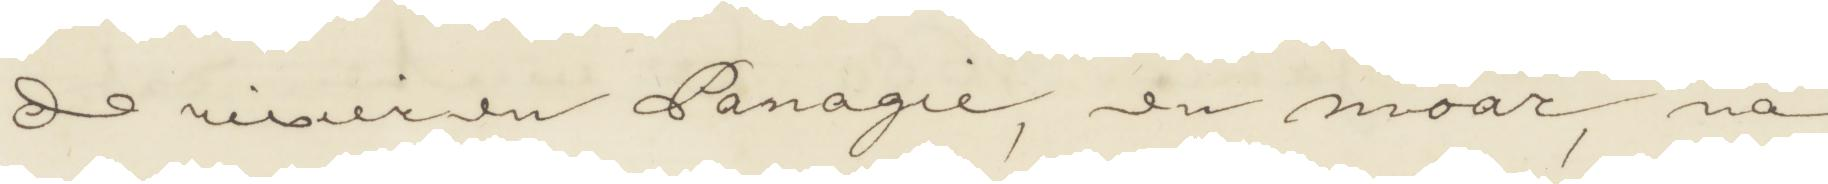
de rivieren Panagie, en moar, na
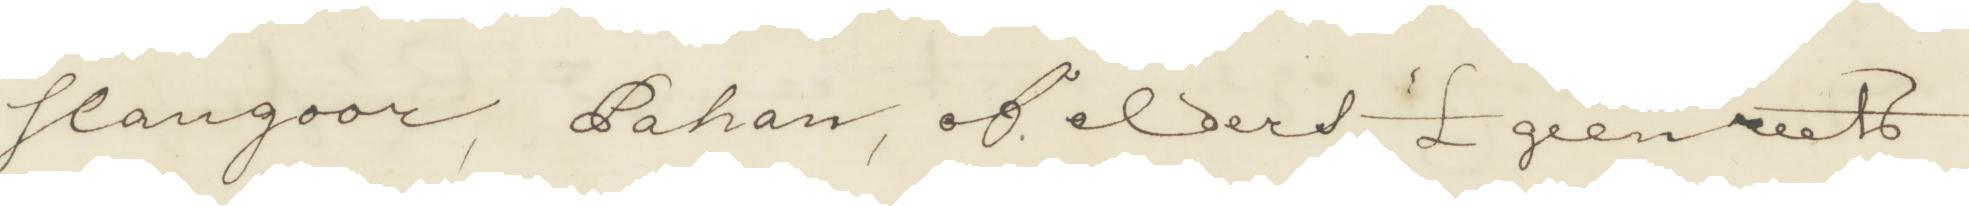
slangoor, Pahan, of elders, ’t geen reets
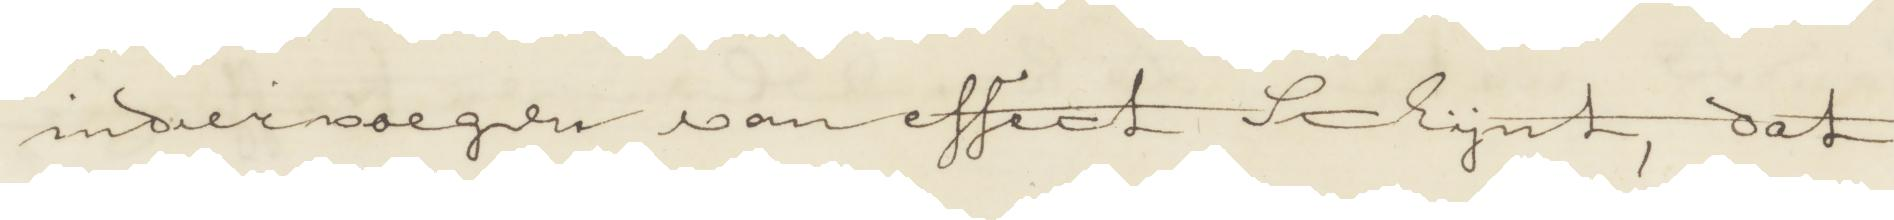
indiervoegen van effect schijnt, dat
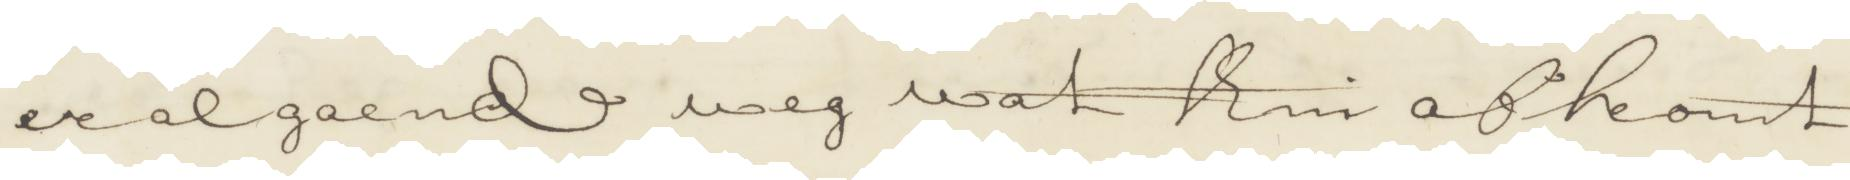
er al gaende weg wat thin afkomt
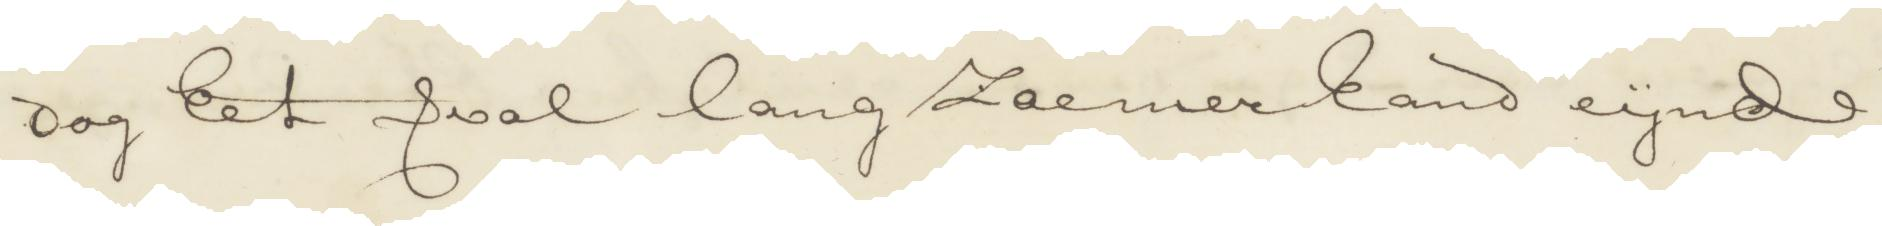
dog het verval lang zaemerhand eijnde
